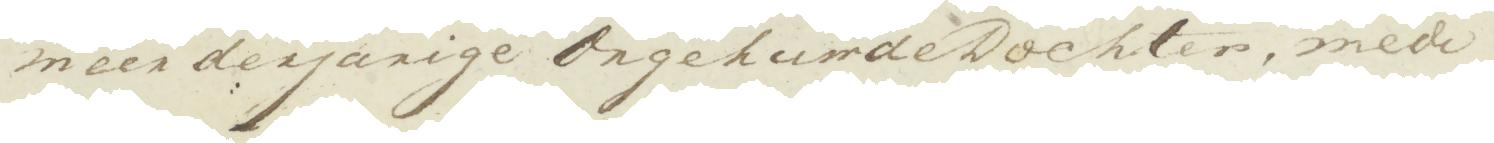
meerderjarige ongehuwde Dochter, mede
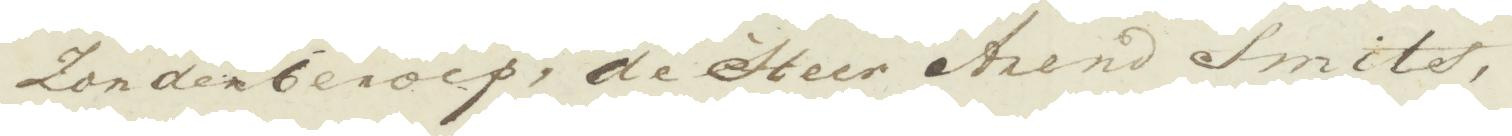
zonder beroep, de Heer Arend Smits,
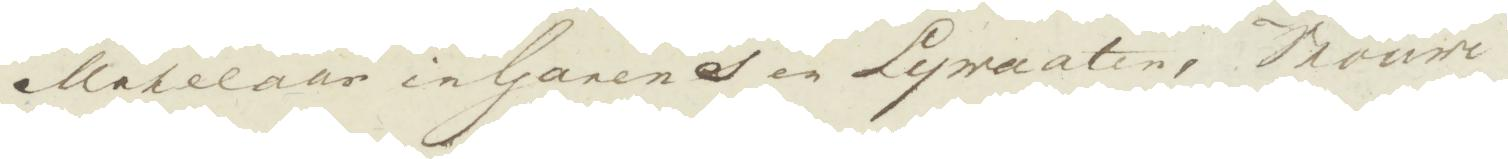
Makelaar in Garens en Lywaaten, Vrouwe
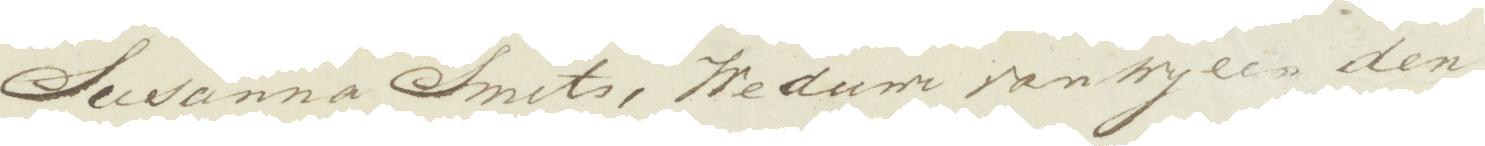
Susanna Smits, weduwe van wylen den
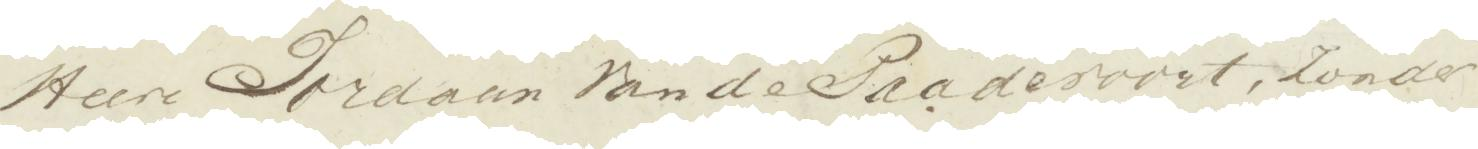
Heere Jordaan van de Paadevoort, zonder
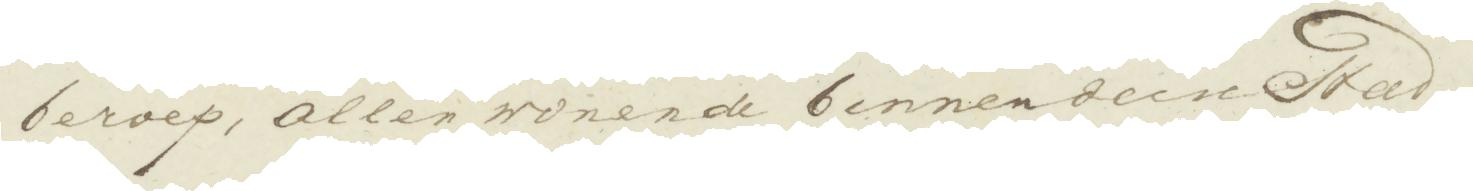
beroep, allen wonende binnen deese stad,
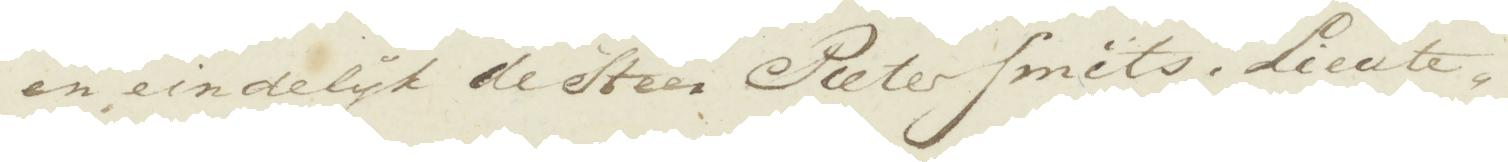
en eindelijk de Heer Pieter Smits, Lieute„
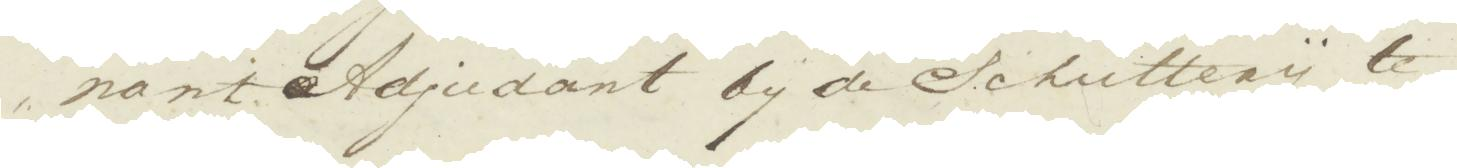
„nant Adjudant bij de Schutterij te
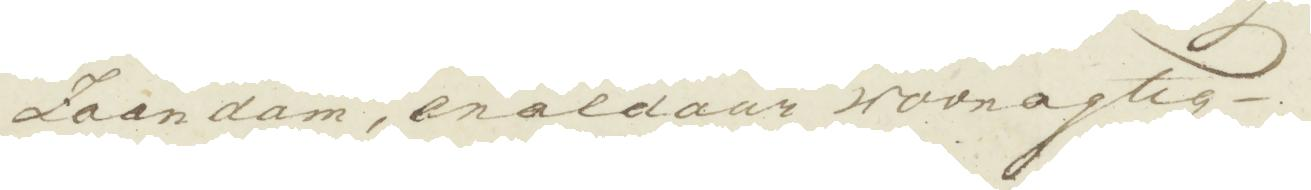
Zaandam, en aldaar woonagtig-.
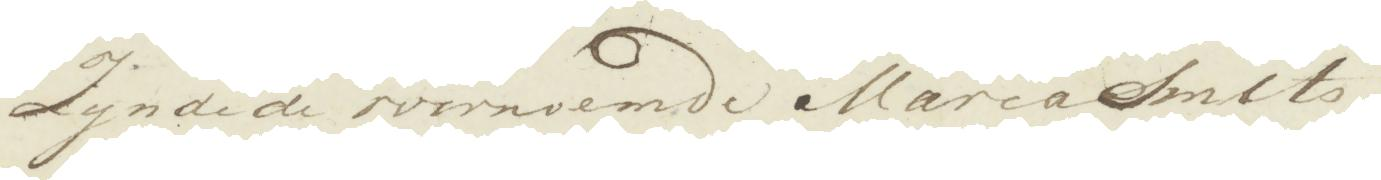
Zynde de voornoemde Maria Smits,
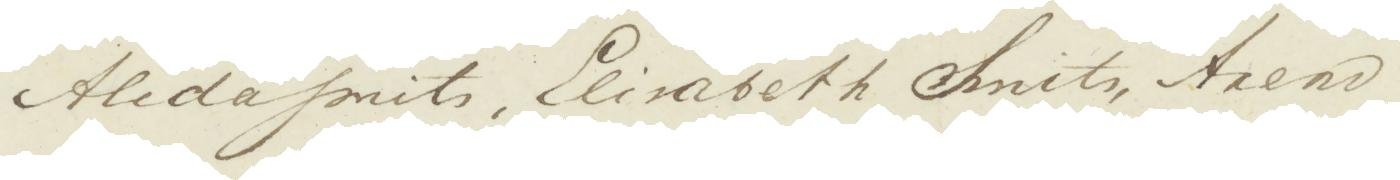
Alida smits, Elisabeth Smits, Arend
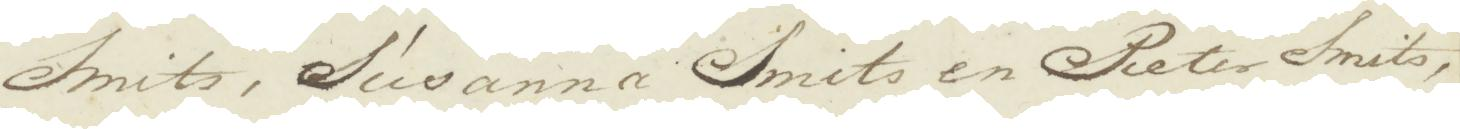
Smits, Susanna Smits en Pieter Smits,
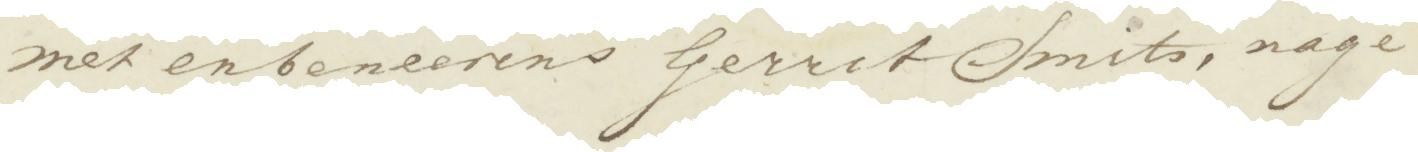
met en beneevens Gerrit Smits, nage
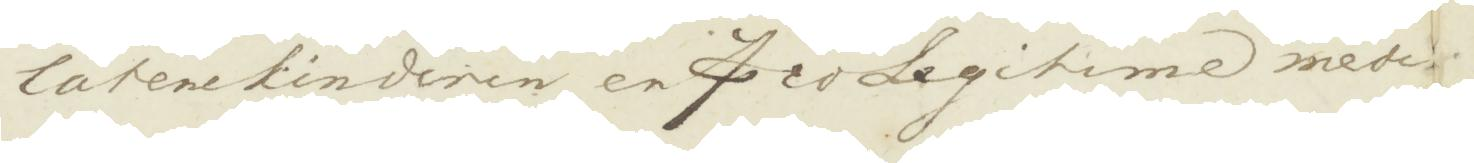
latene kinderen en Pro Legitime mede
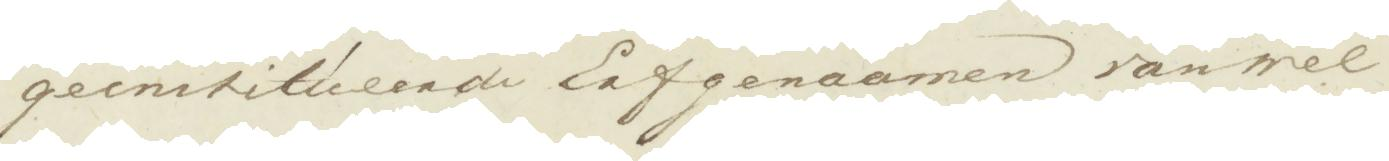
geinstitueerde Erfgenaamen van wel
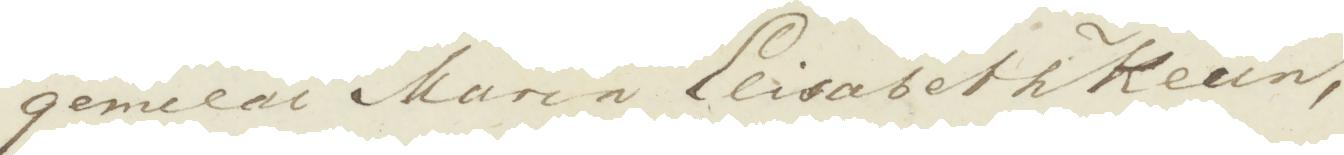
gemelde Maria Elisabeth Keun,
